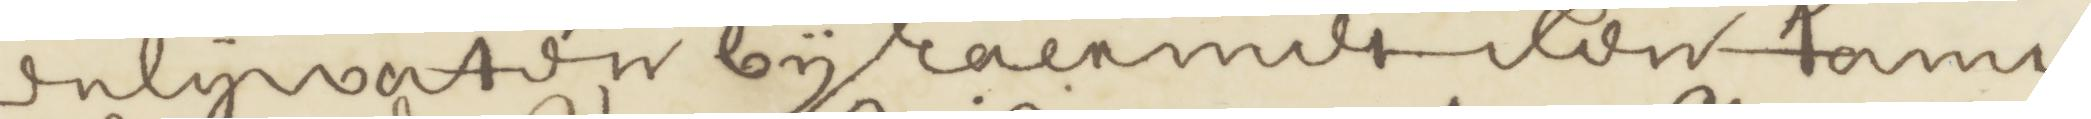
en lijwaten bij haer met Een tame
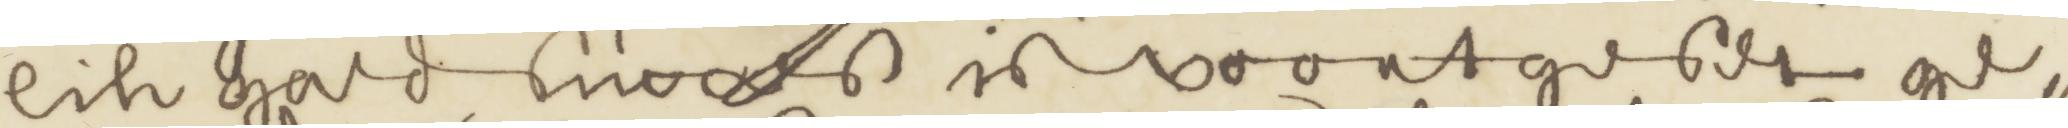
lik goed succes is voortgeset ge„
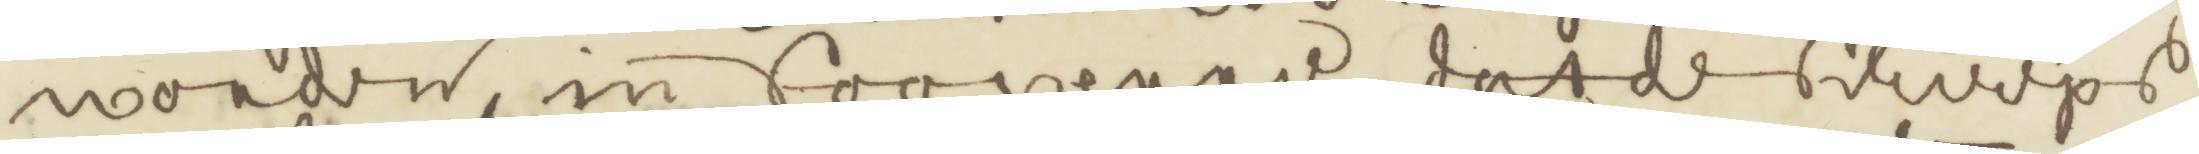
worden, in sooverre, dat de scheeps
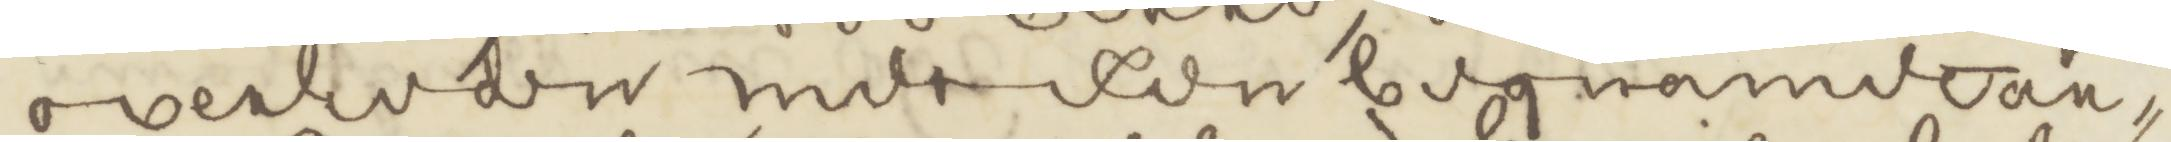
overheden met Een bequame car„
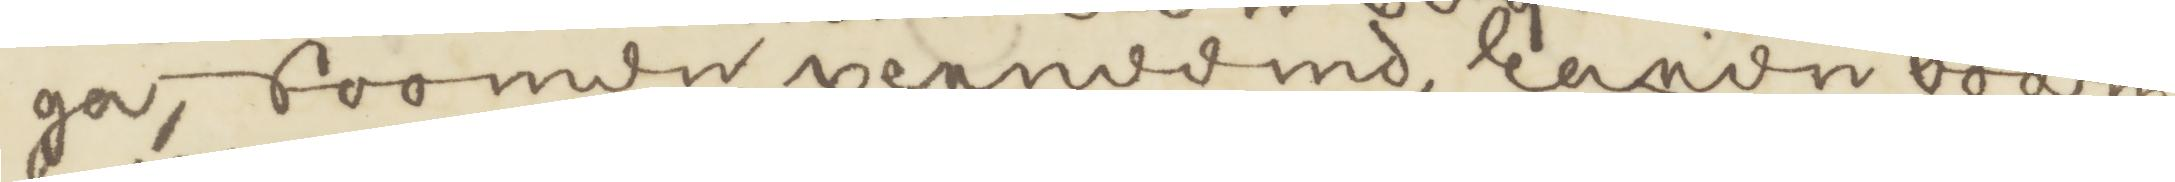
ga, soomen verneemd, haren bodem
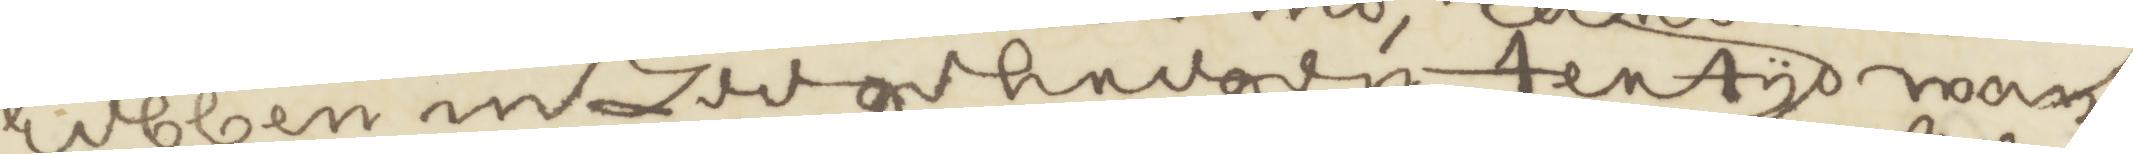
hebben in zeegekregen ter tijd wan
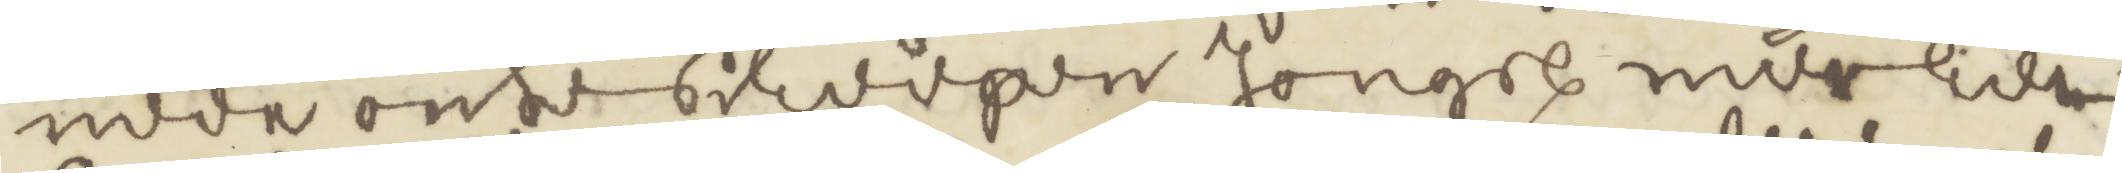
neer onse scheepen Jongst met het
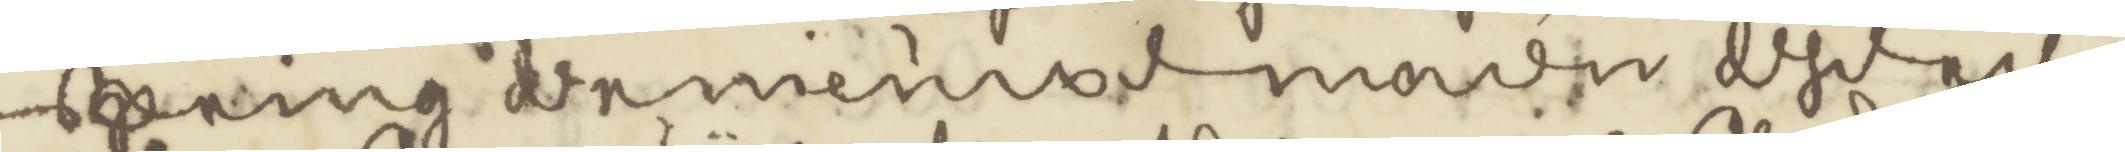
spring der nieuwe maen dese re
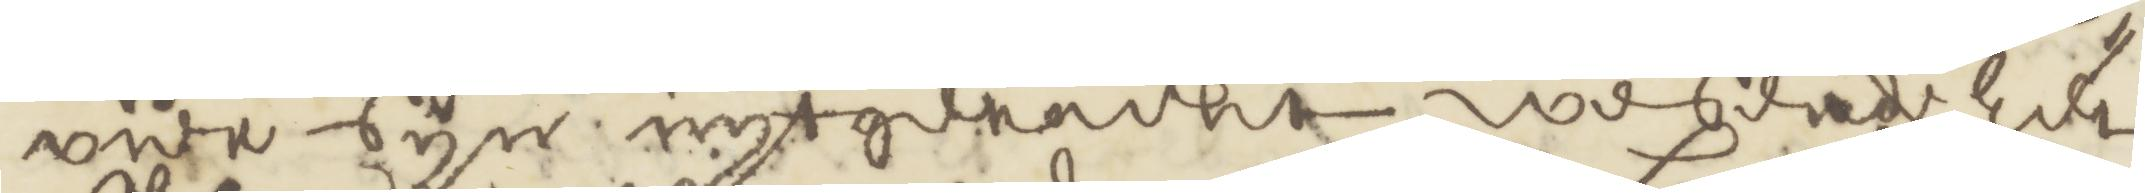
vier sijn uijtgeraekt wesende het
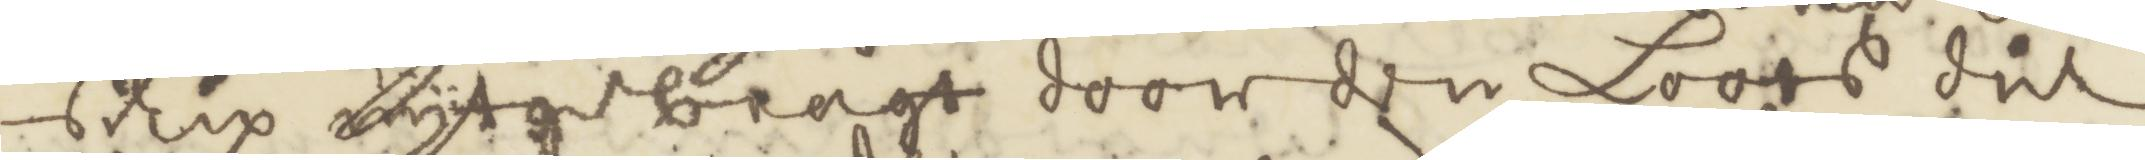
schip uijtgebragt door den Loots die
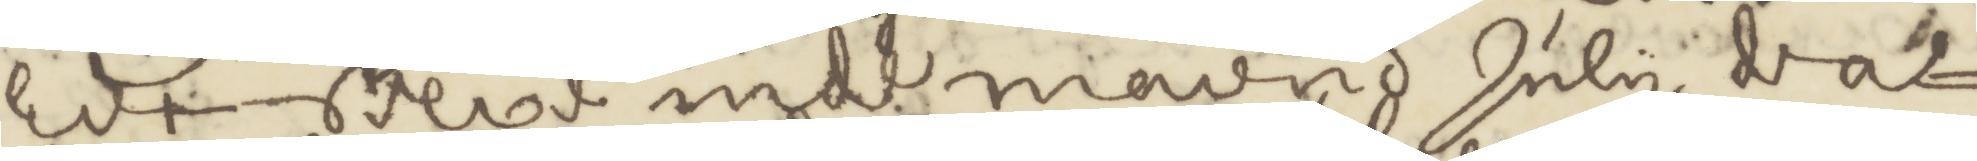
het selve in de maend Julij de a=o
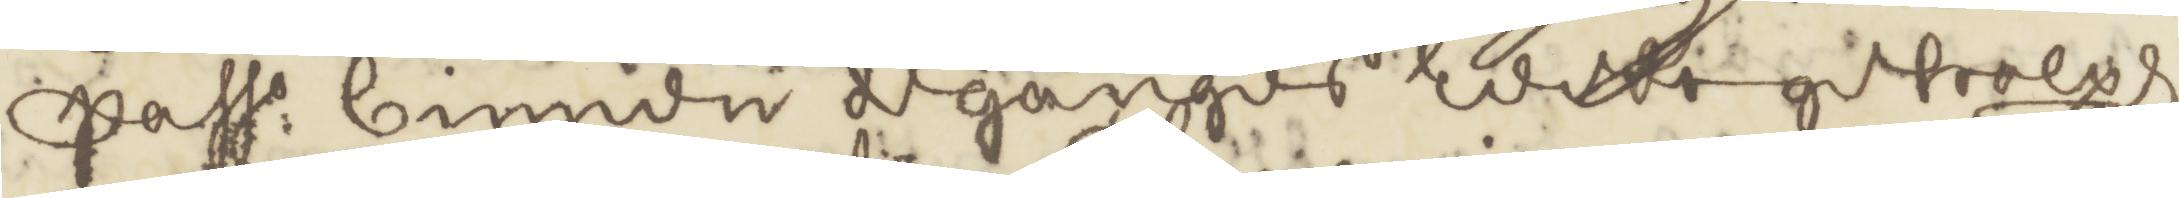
pass:o binnen de ganges heeft geholpen
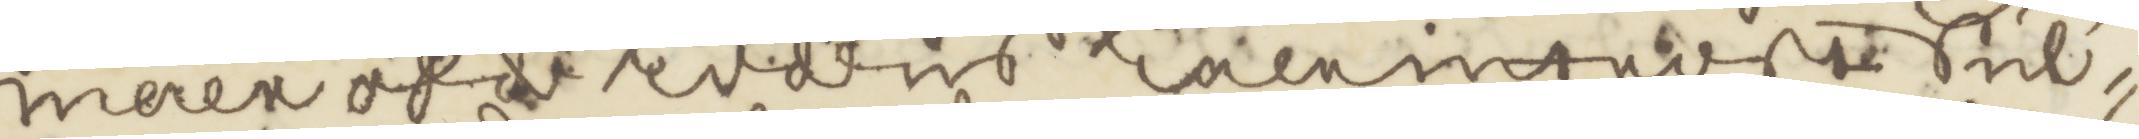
maer of de redens haer intreste sul„
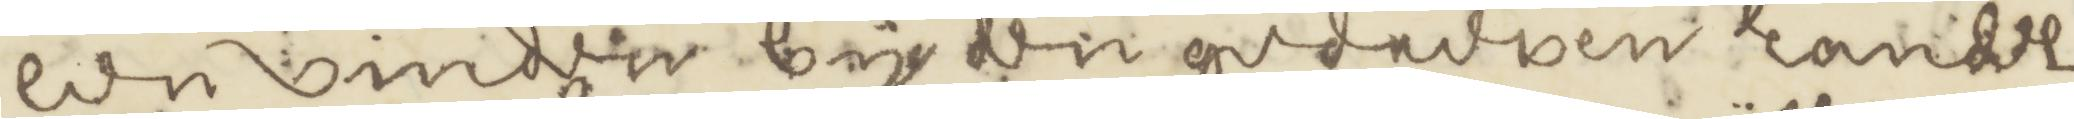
len vinden bij den gedreven handel
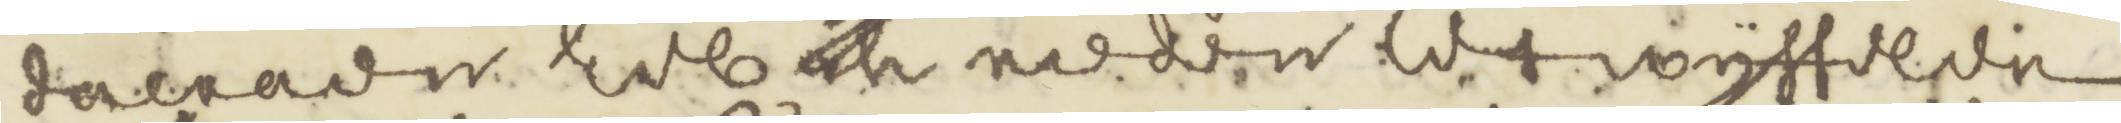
daeraen: heb ik reden te twijffelen
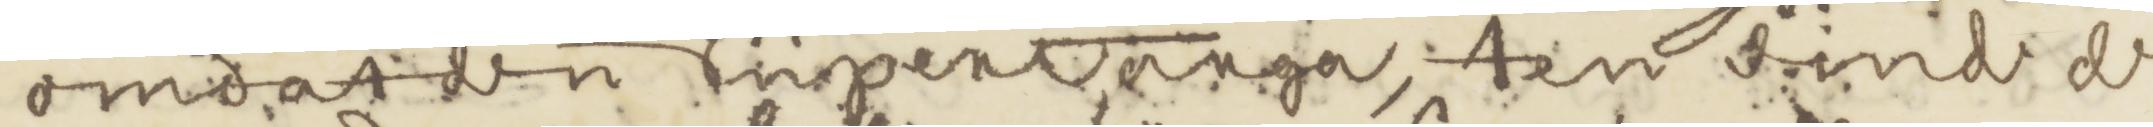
omdat den supercarga, ten sende de
